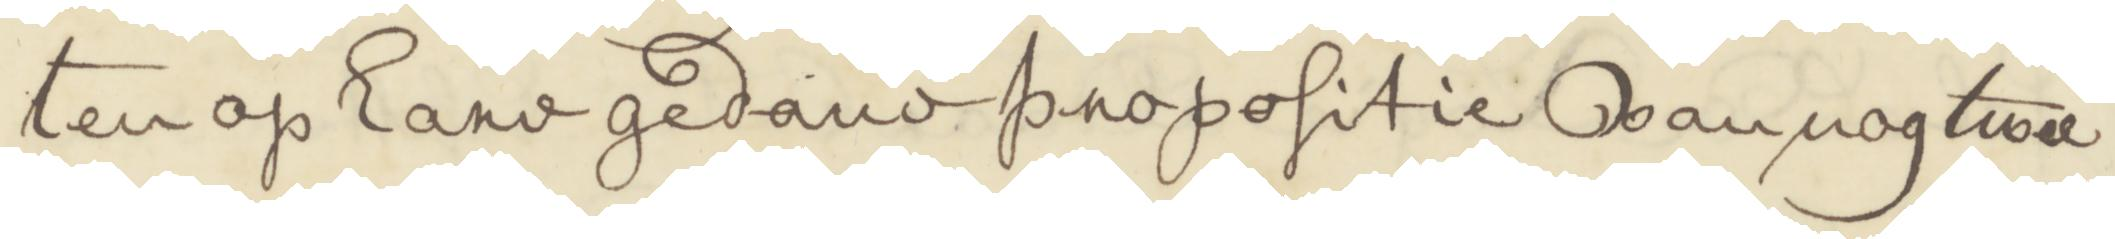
ten op hare gedane propositie van nog twee
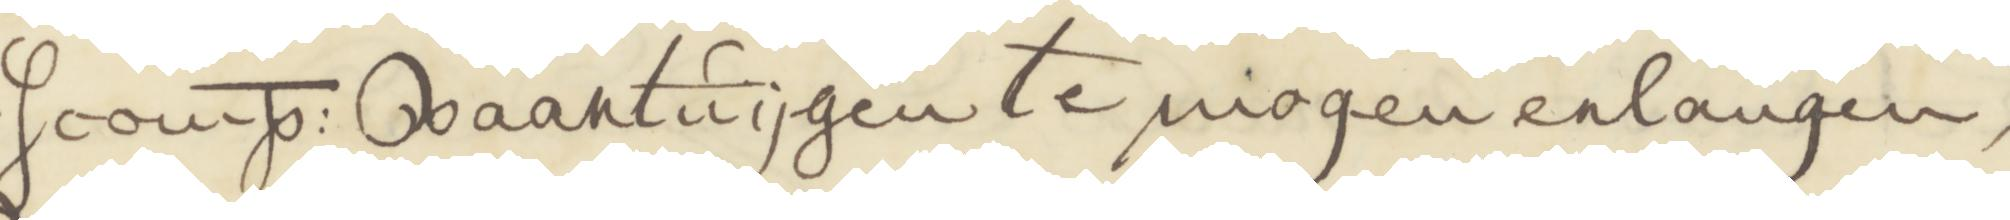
s comp: vaartuijgen te mogen erlangen,
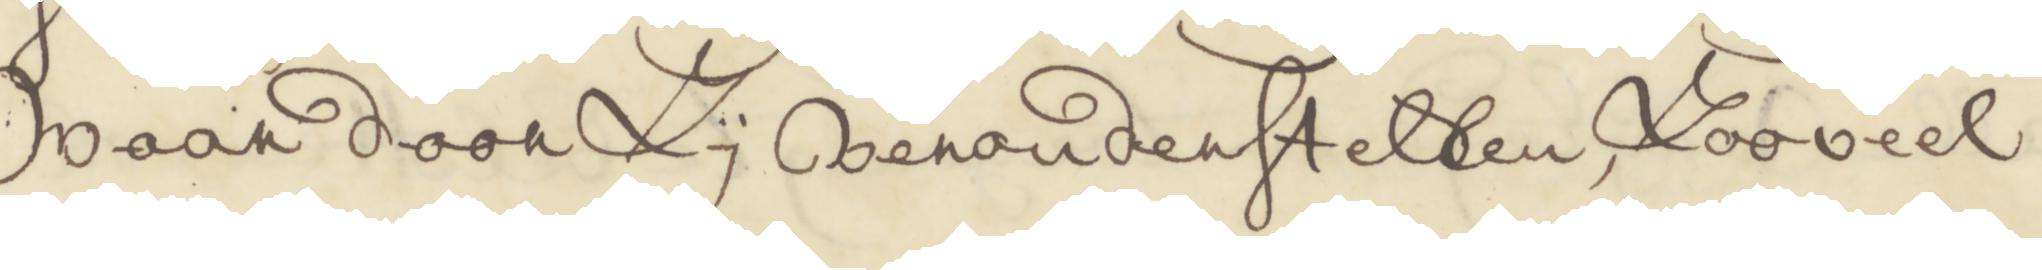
Waar door zij veronderstelden, zoo veel
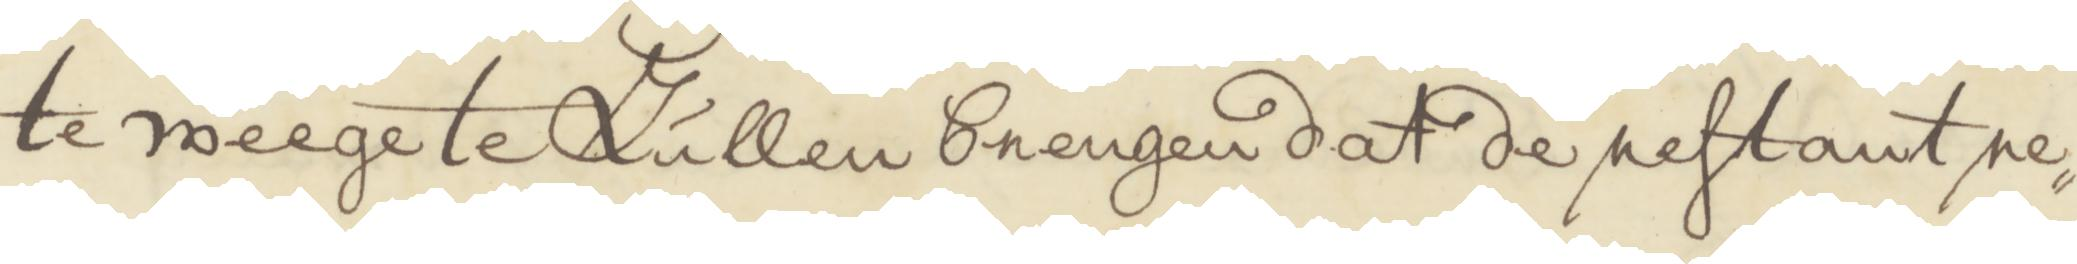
te weege te zullen brengen dat de restant re„
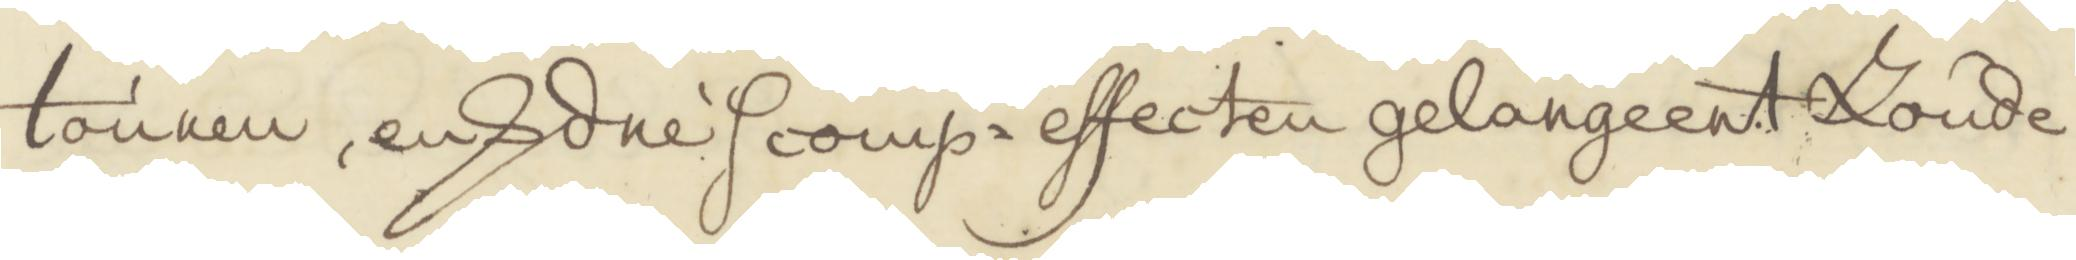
touren, en verdre 's comp:s effecten gelargeert zoude
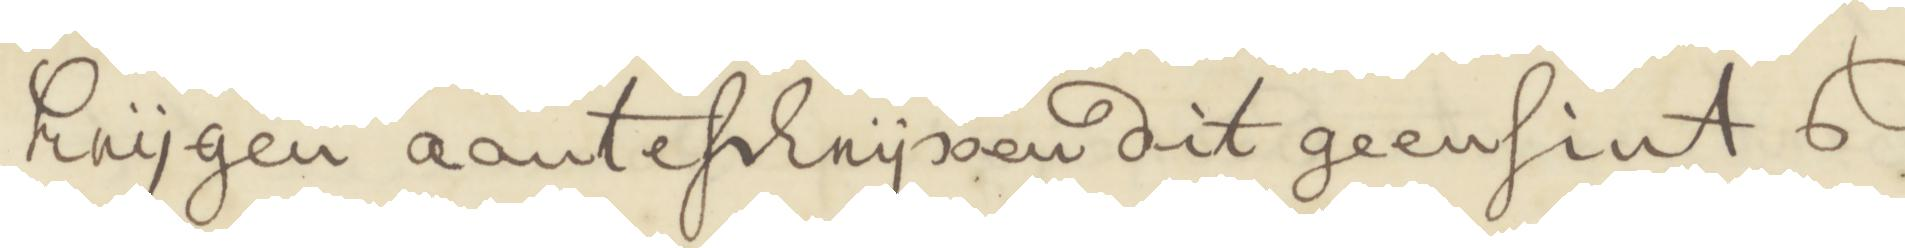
krijgen aanteschrijven dit geensint s
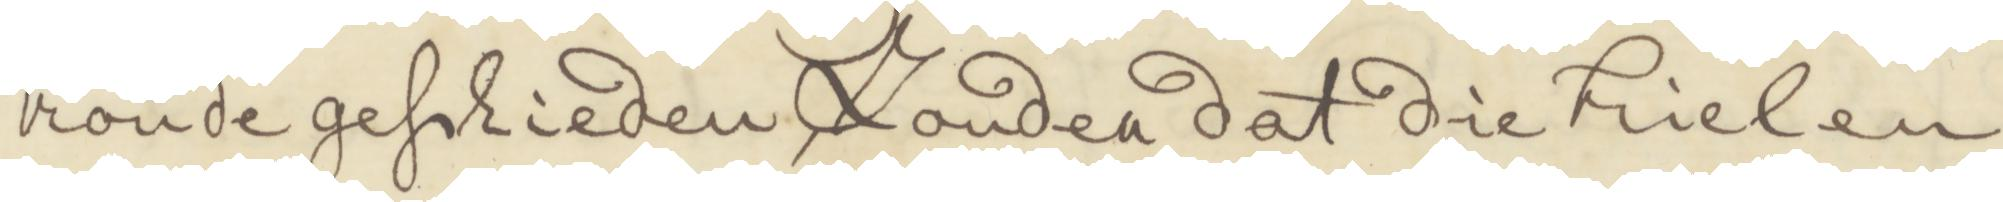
konde geschieden, zonder dat die kiel en
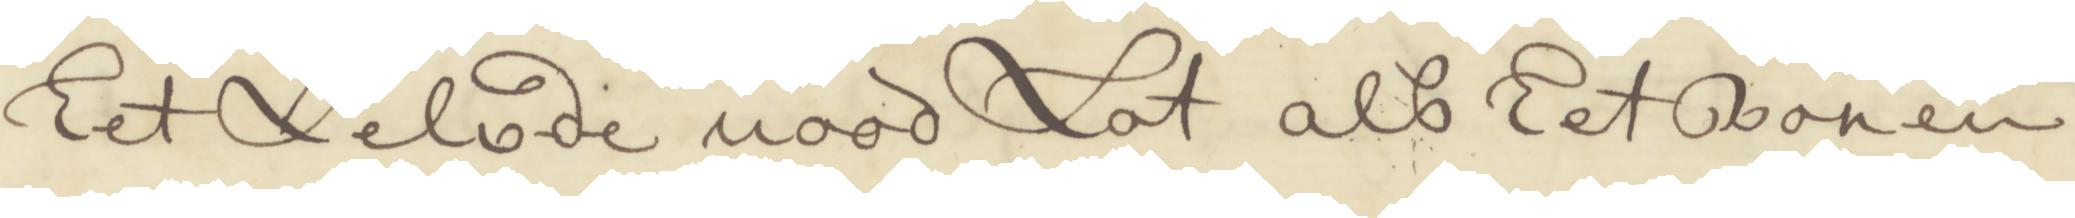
het zelvde nood Lot als het voren
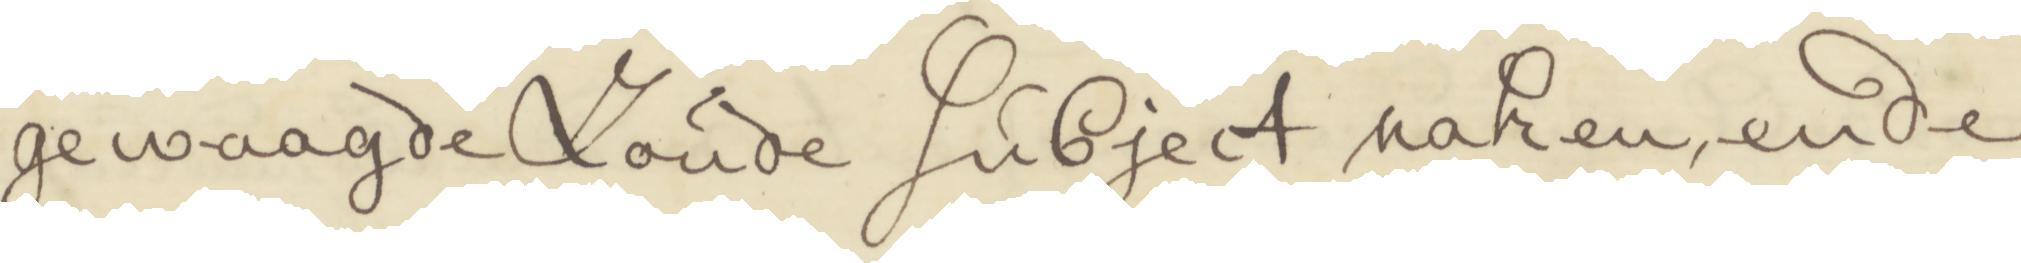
gewaagde zoude Subject raken, ende
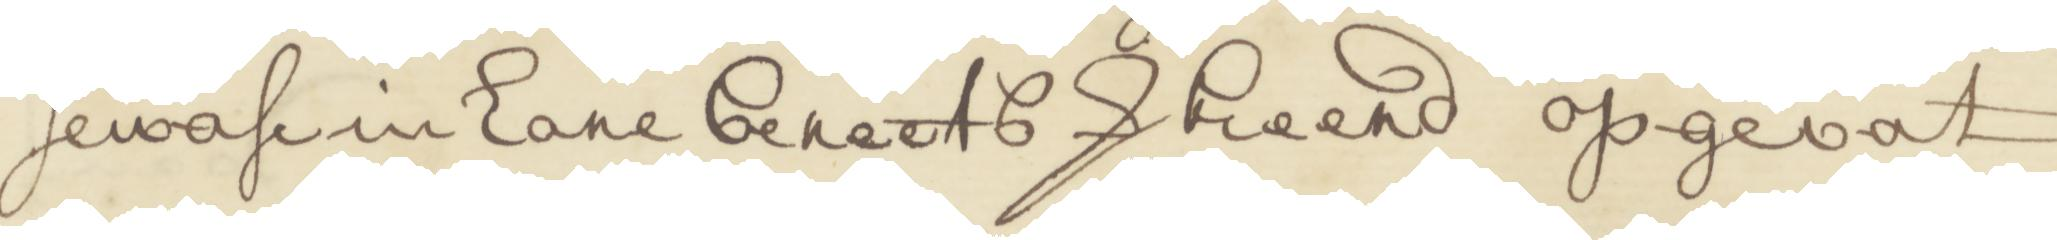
sewase in hare bereets verkeerd op gevat
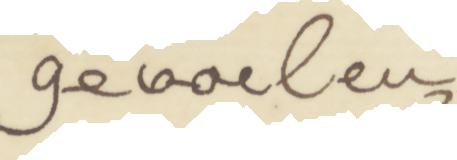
gevoelen
